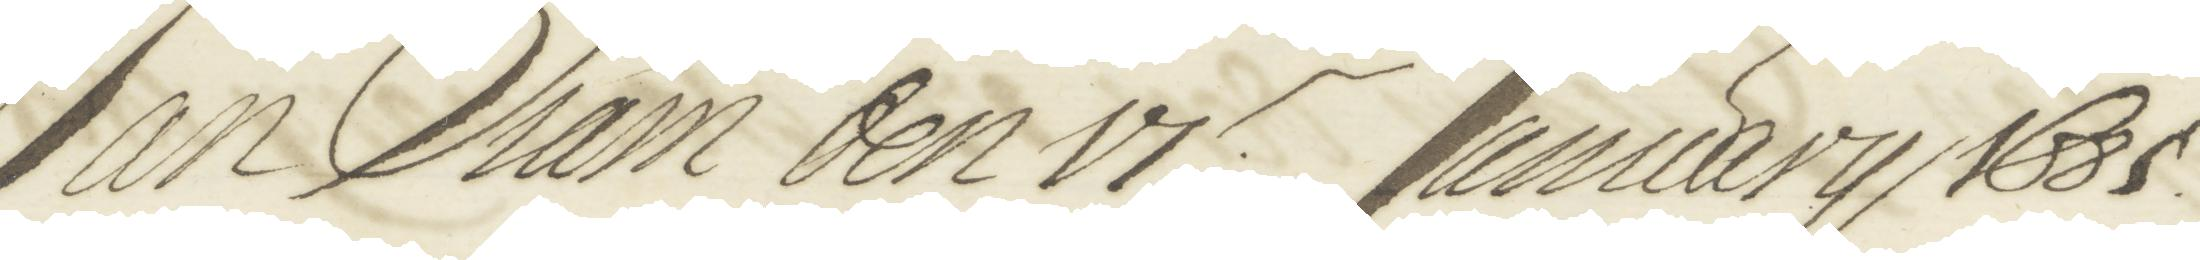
Van Siam den 17:' Januarij 1685.
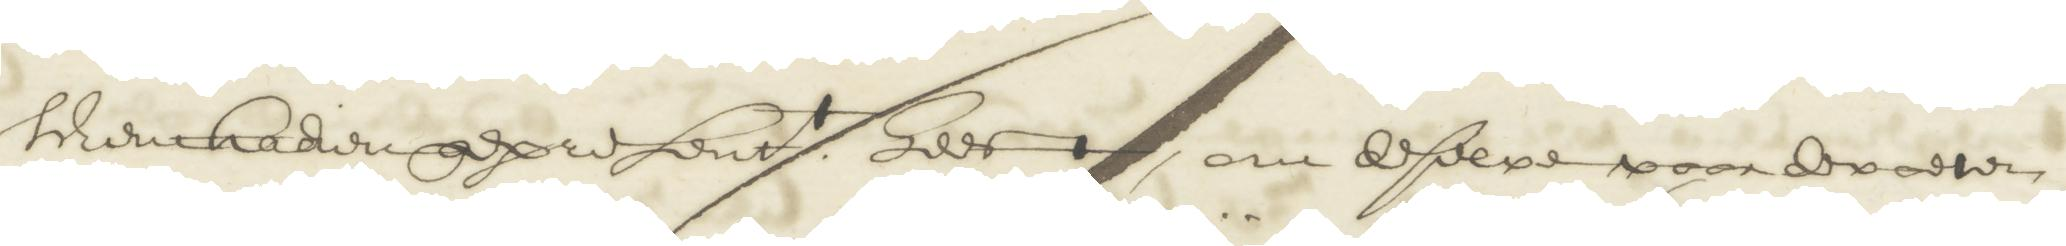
schenckadien gepresent.t heeft, om deselve voor de voeten
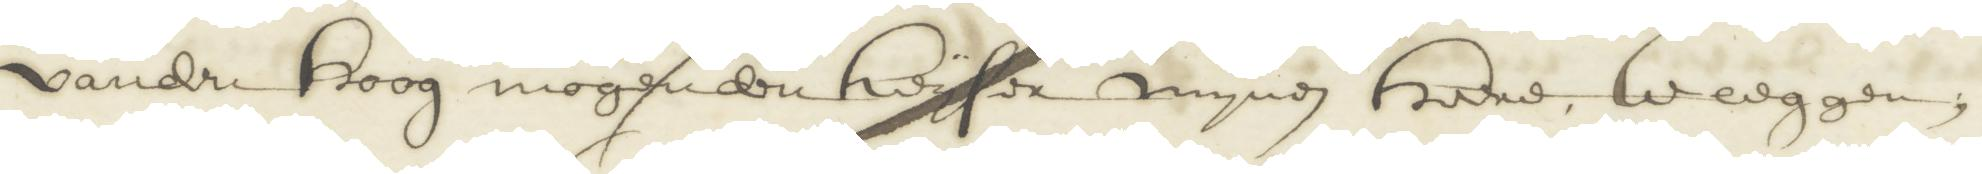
van den Hoog mogenden keijser mijnen Heere, te leggen;
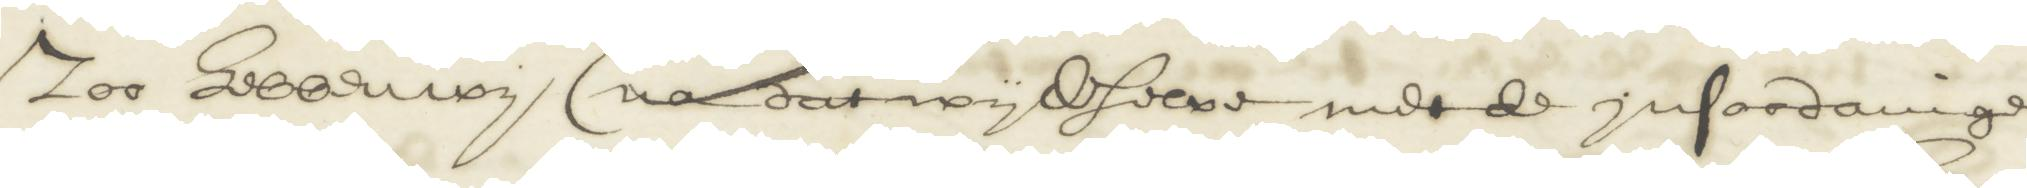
zoo hebben wij (na dat wij deselve met de jnsoodanige
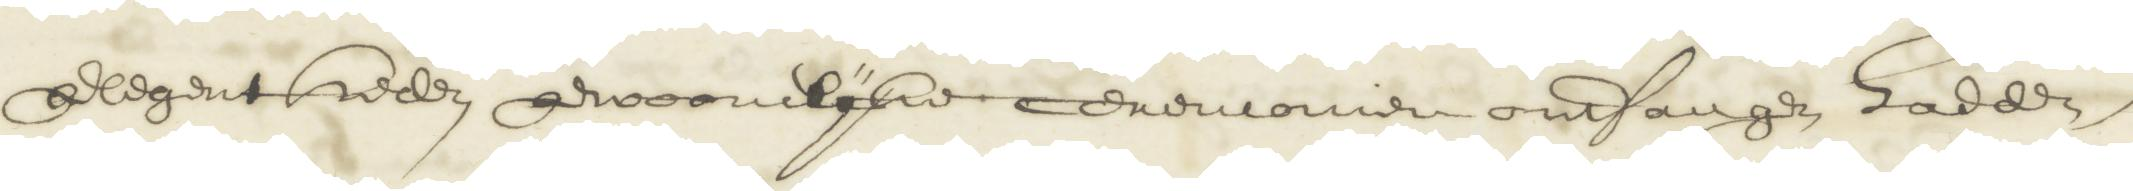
gelegentheden gewoonelijke ceremonien ontfangen hadden)
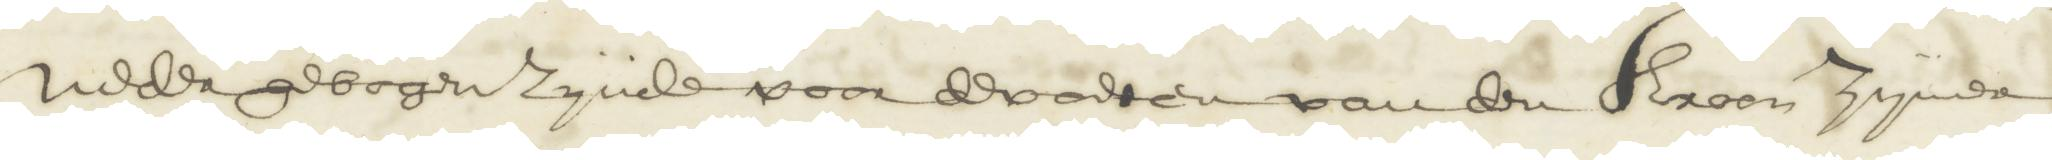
nedergebogen zijnde voor de voeten van den throon zijner
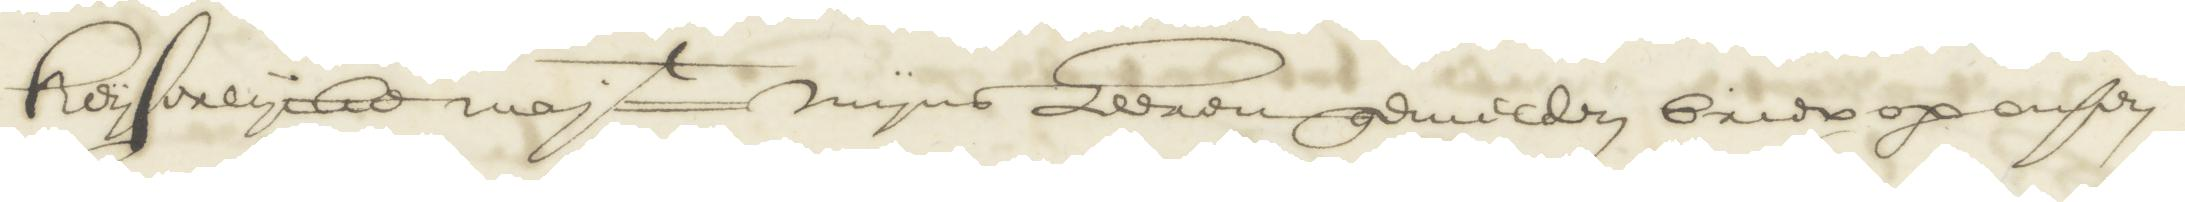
keijserlijcke maj=t mijns Heeren gemelden briev op onsen
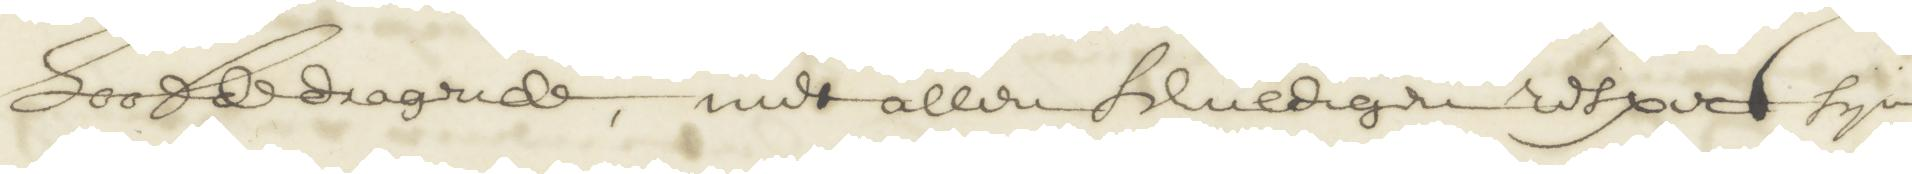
hoofde dragende, met allen schuldigen respect sijn
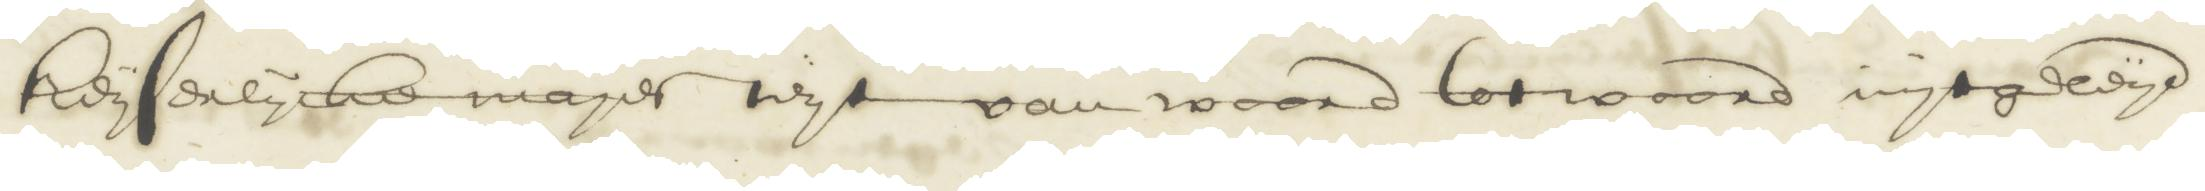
keijserlijcke majesteijt van woord tot woord uijtgeleijd
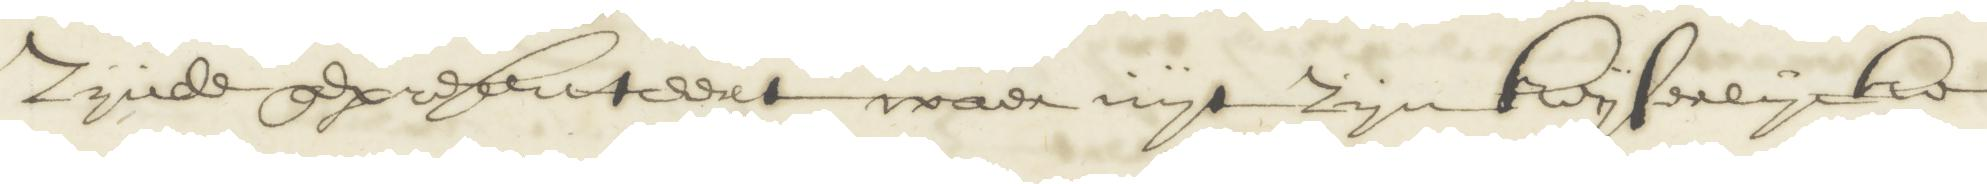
zijnde gepresenteert waer uijt zijn keijserlijcke
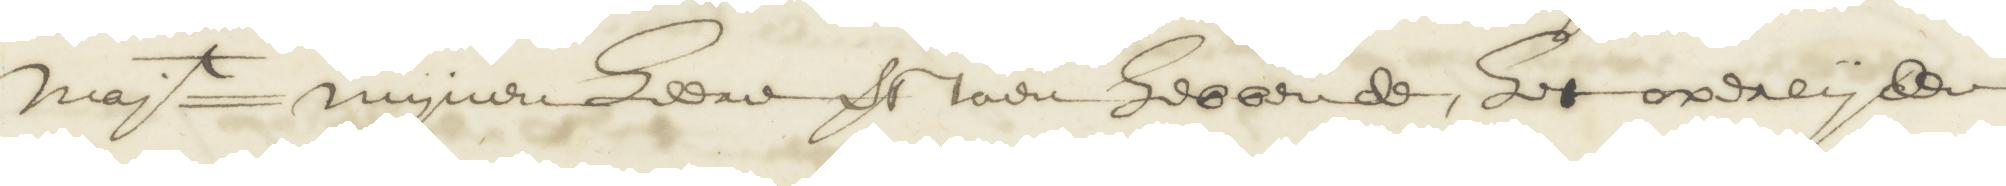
maj=t mijnen Heere verstaen hebbende, het overlijden
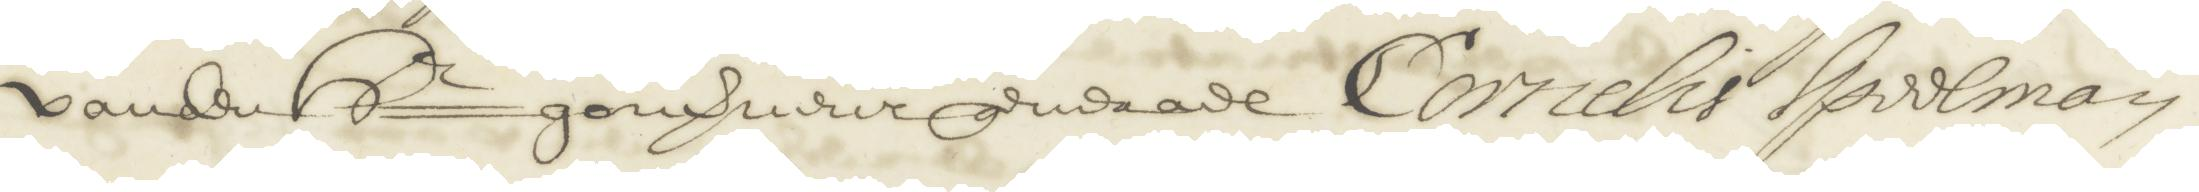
van den H=r gouverneur generael Cornelis Speelman
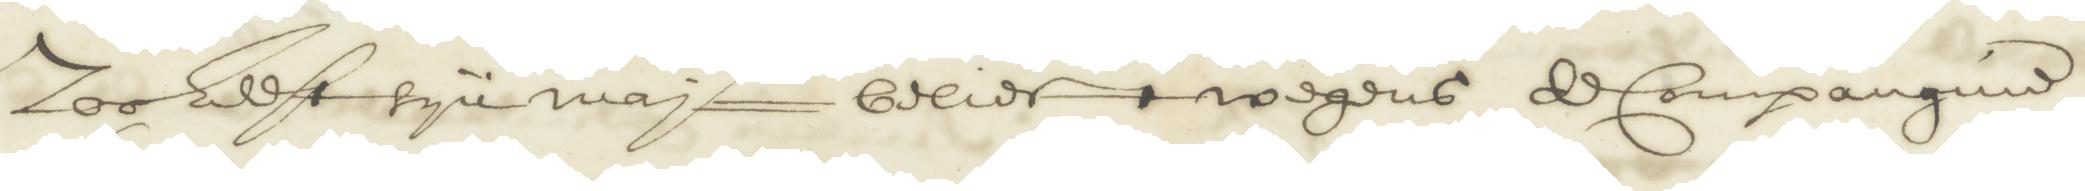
zoo heeft sijn maj=t belieft wegens de Compangnie
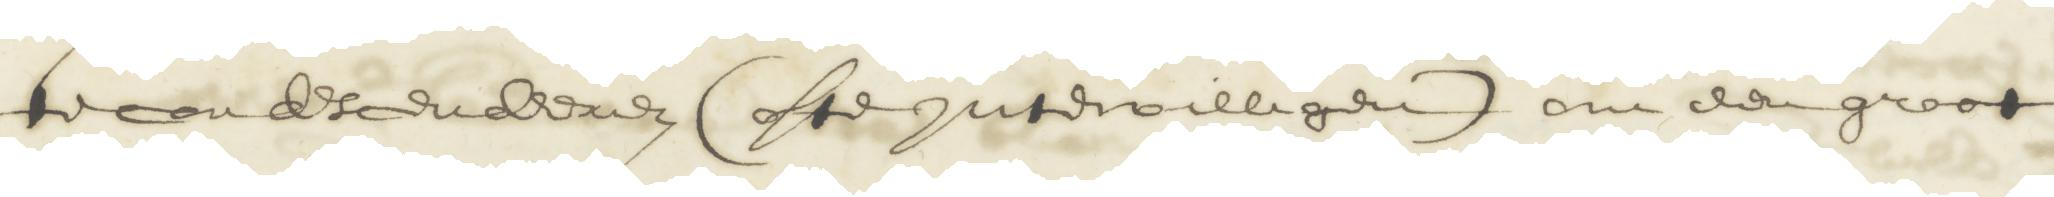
te condescendeeren (ofte jntewilligen) om een groot
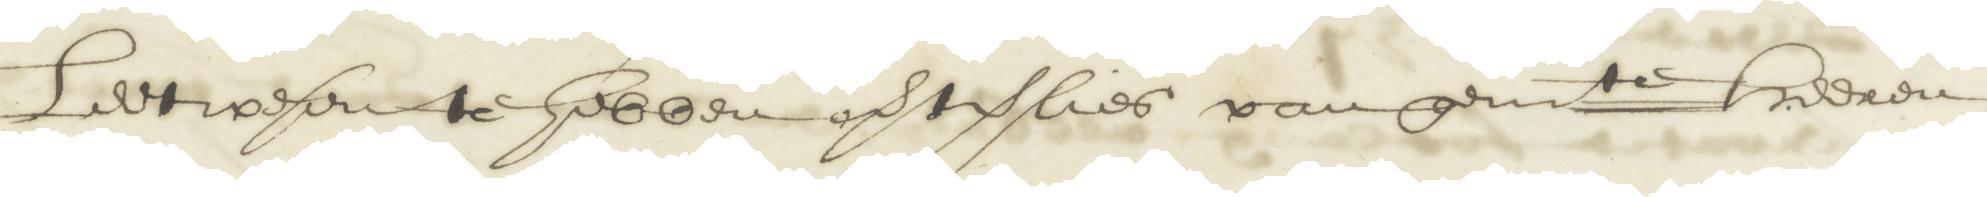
Leetwesen te hebben over t verlies van gem=te Heeren
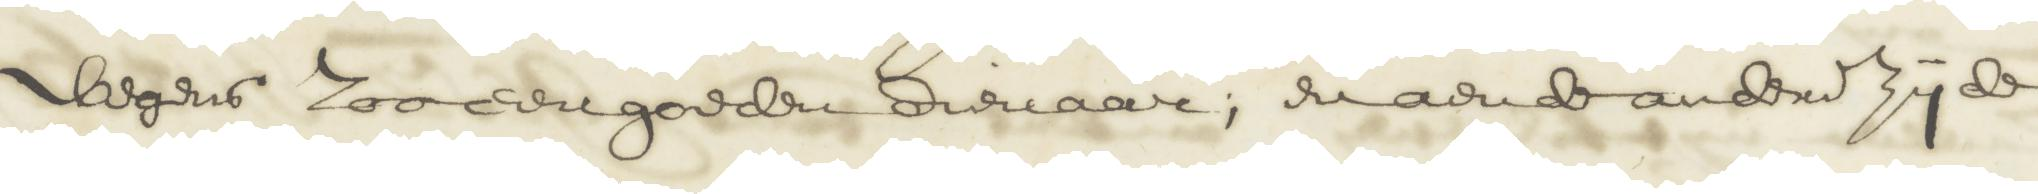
wegens zoo een goeden dienaar; en aen de andere zijde
